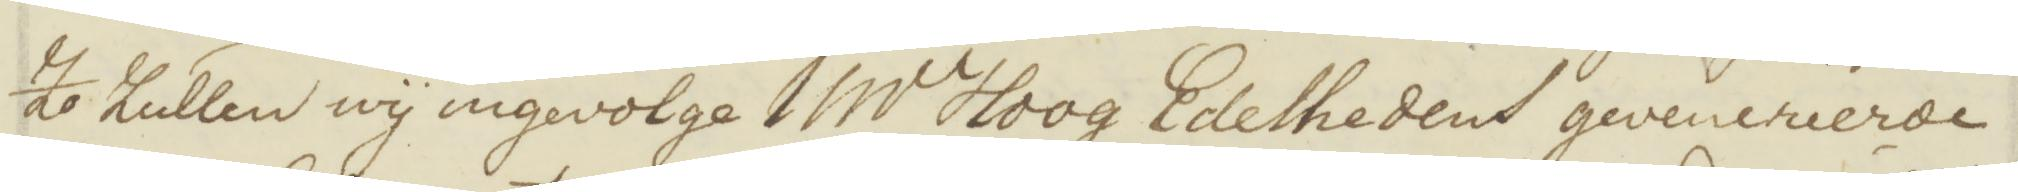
Zo zullen wij ingevolge UW Hoog Edelhedens gevenereerde
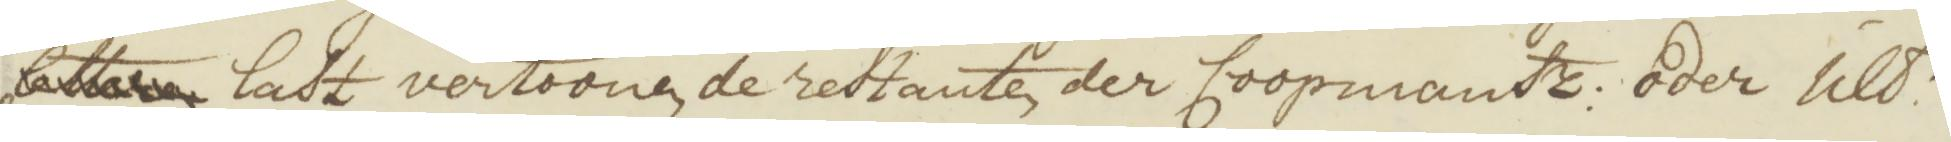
lettere last vertoonen de restanten der Coopmansz: oder ult:o
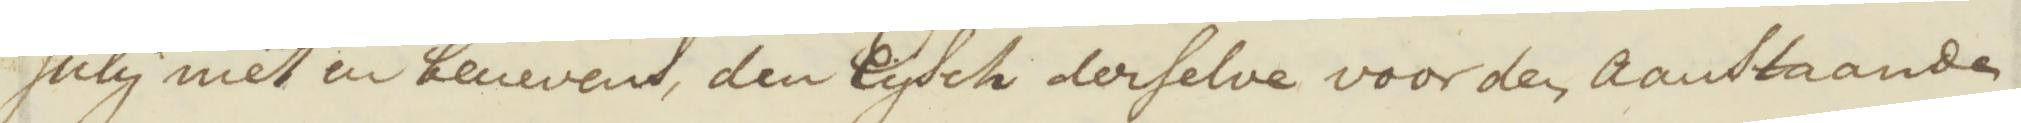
Julij met en benevens, den Eijsch derselve voor den aanstaande
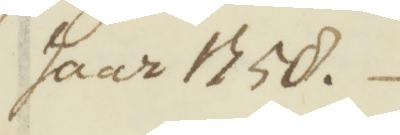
Jaar 1758. —
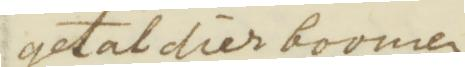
getal dier boomen
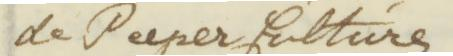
de Peeper Culture
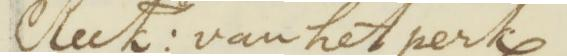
Reek: van het perk
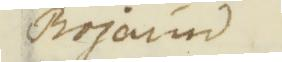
Bojauw
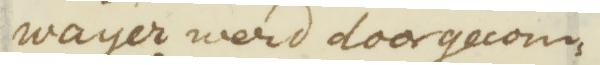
waijer werd door gecom„
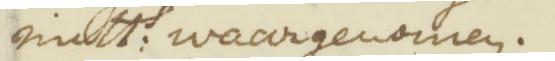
mitt:s waargenomen.
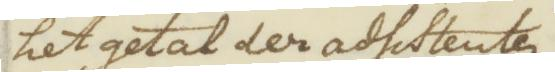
het getal der adsistenten
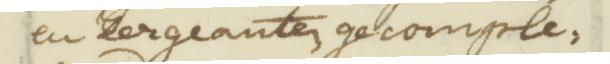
en sergeanten gecomple:
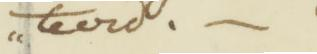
„teerd. —
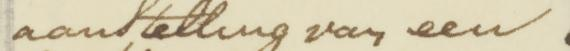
aanstelling van een
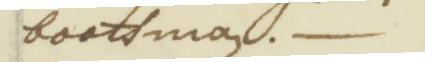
bootsman. —
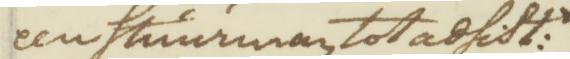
een stuurman tot adsist:t
